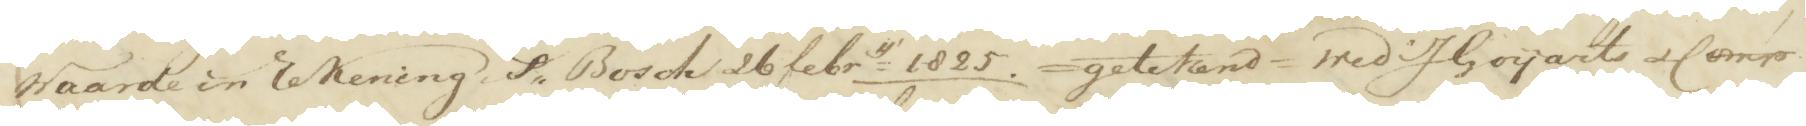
waarde in rekening, S„ Bosch 26 febr=ij 1825. =getekend= Wed J Goijants & Comp
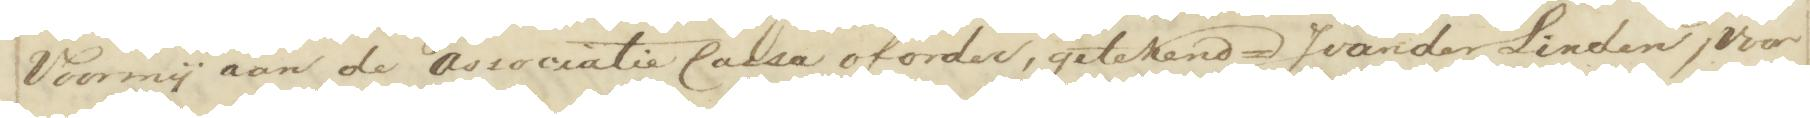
Voor mij aan de associatie Cassa of order, getekend= J vander Linden, voor
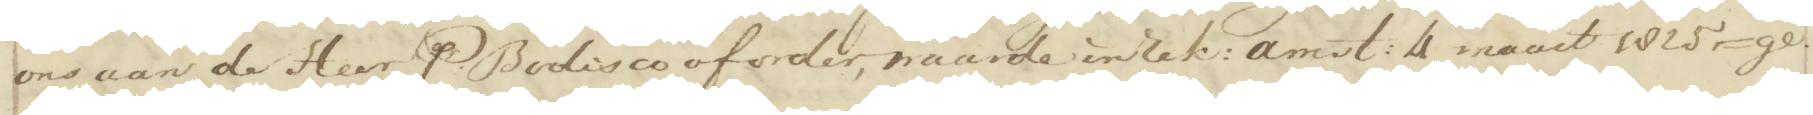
ons aan de Heer P: Bodisco of order, waarde in rek: amst: 4 maart 1825 =ge
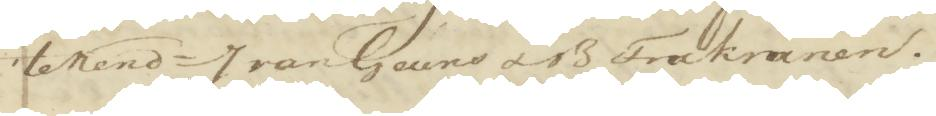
tekend= J van Geurs & B Trakranen.
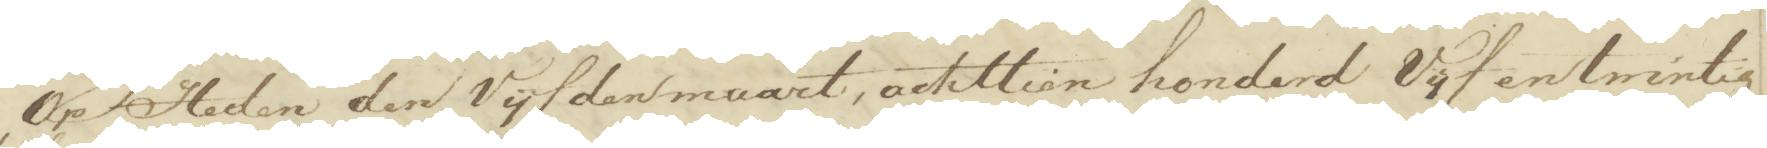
op Heden den Vijfden maart, achttien honderd Vijf en twintig
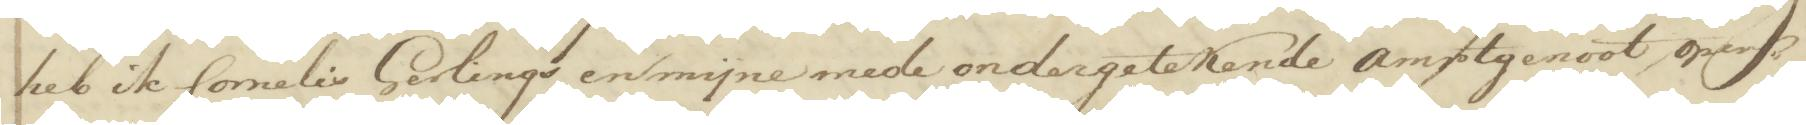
heb ik Cornelis Gerlings en mijne mede ondergetekende amptgenoot, open
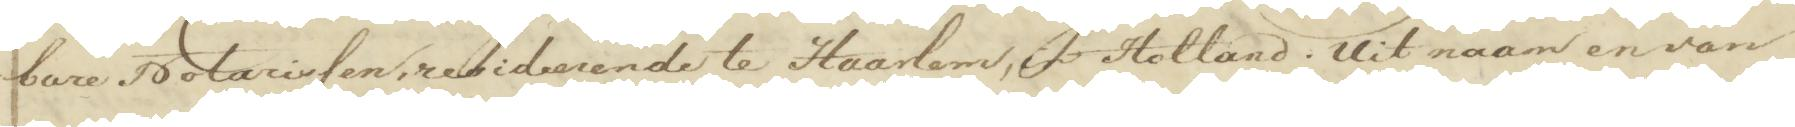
bare Notarissen, resideerende te Haarlem, in Holland, uit naam en van
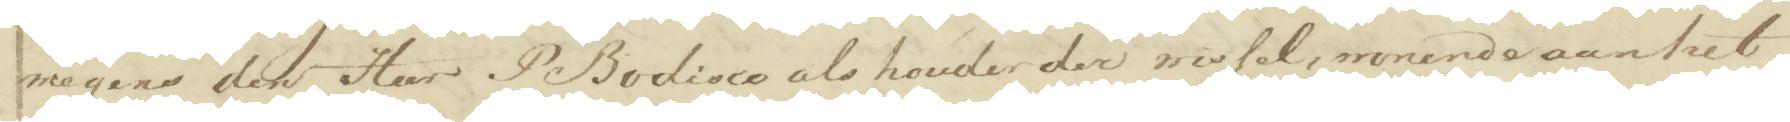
wegens den Heer P Bodisco als houder der wissel, wonende aan het
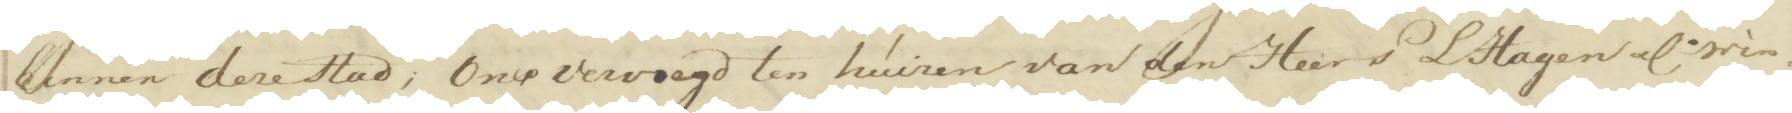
binnen deze stad; Ons vervoegd ten huizen van den Heer P L Hagen & Co win„
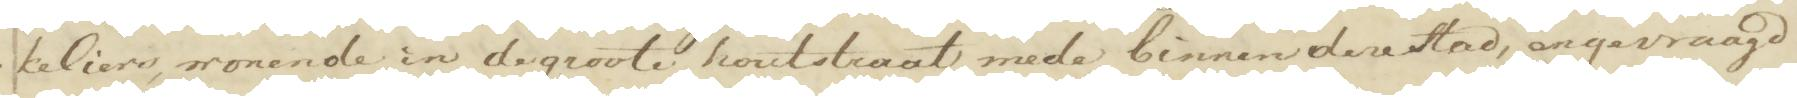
keliers, wonende in de groote houtstraat mede binnen deze stad, en gevraagd
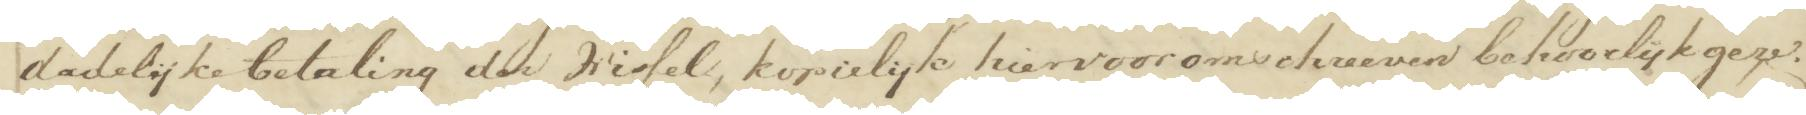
dadelijke betaling der Wissel, kopielijk hier voor omschreeven behoorlijk geze
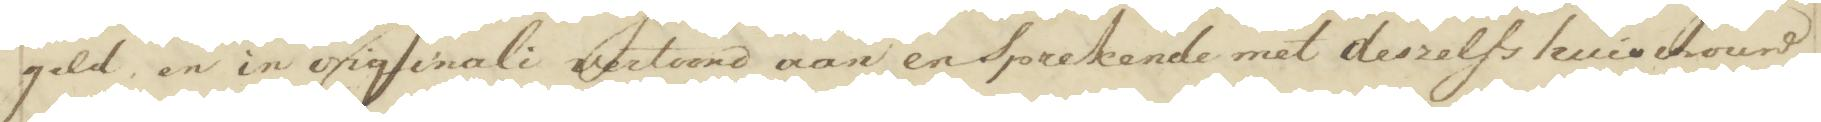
geld, en in originali vertoond aan en sprekende met deszelfs huisvouw
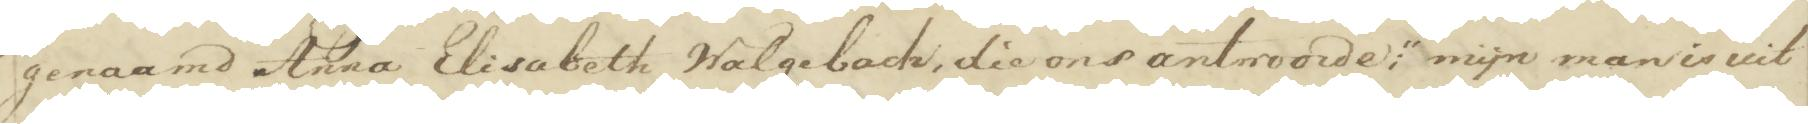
genaamd Anna Elisabeth Walgebach, die ons antwoorde: "mijn man is uit
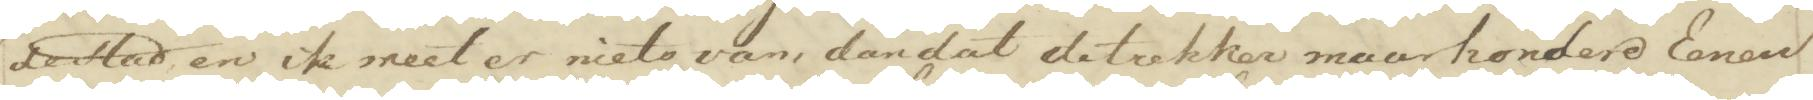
de stad, en ik meet er niets van dan dat de trekker maar hondere Eenen
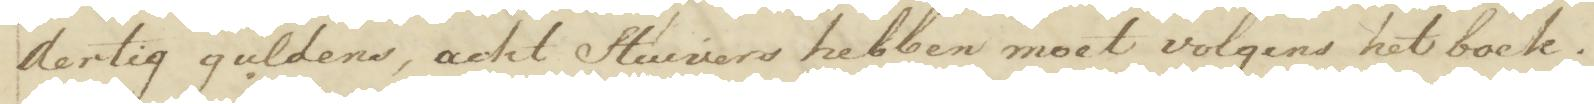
dertig guldens, acht Stuivers hebben moet volgens het boek
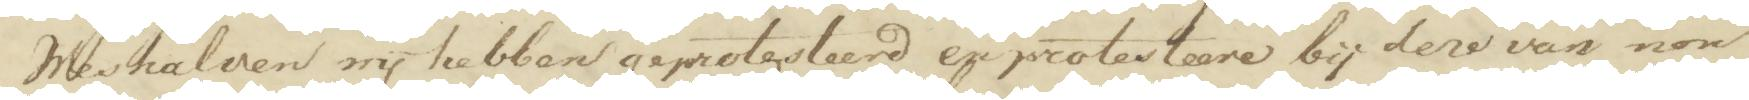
Weshalven wij hebben geprotesteerd en protesteere bij deze van non
